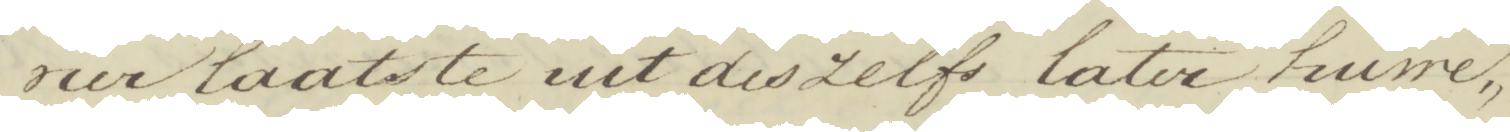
vier laatste uit deszelfs later huwe„
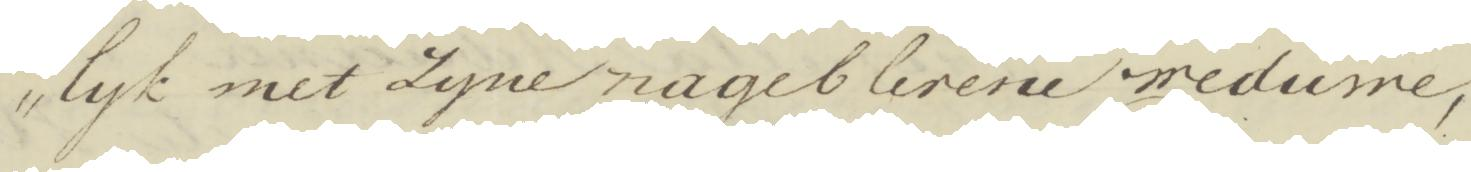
„lyk met zyne nageblevene weduwe,
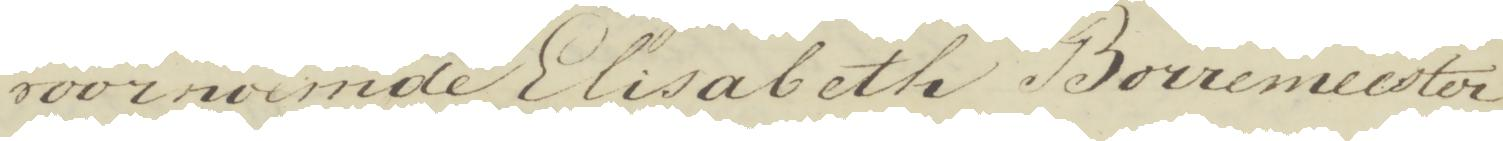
voornoemde Elisabeth Borremeester
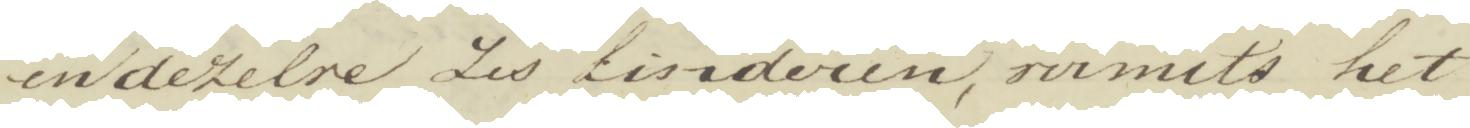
en dezelve zes kinderen, vermits het
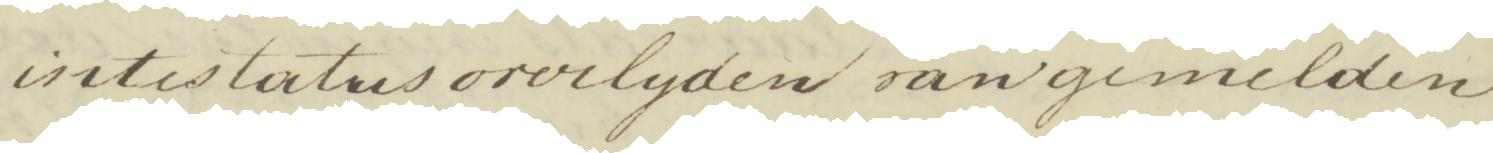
intestatus overlyden van gemelden
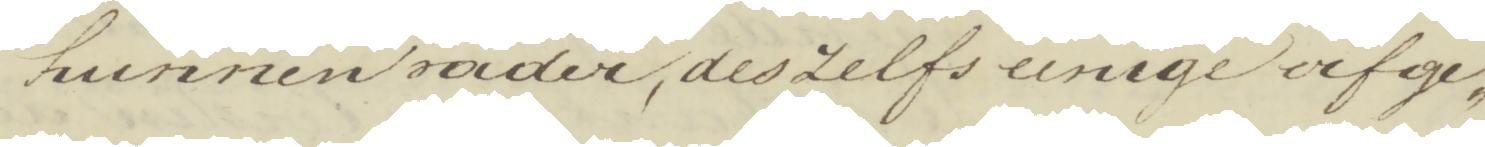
hunnen vader, deszelfs eenige erfge
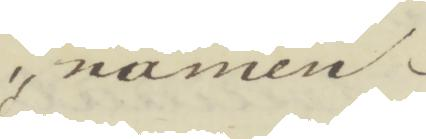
„namen
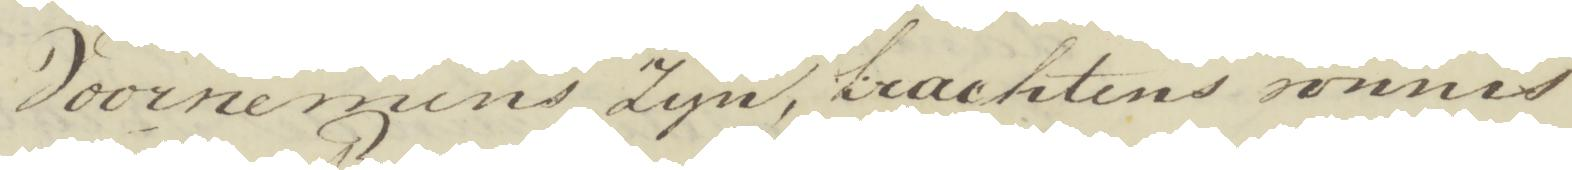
Voornemens zyn, krachtens vonnis
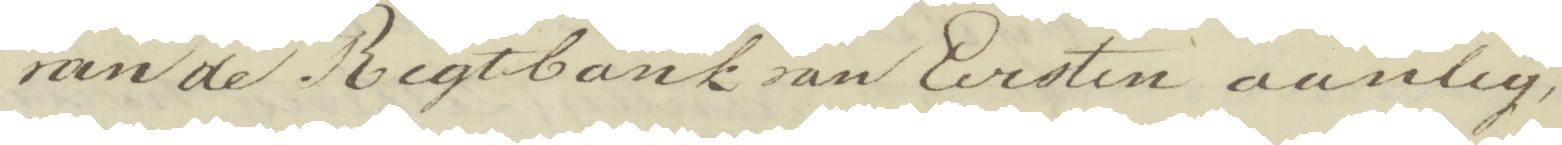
van de Regtbank van Eersten aanleg,
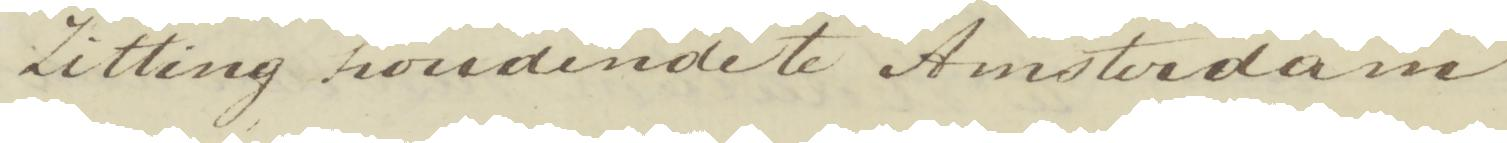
zitting houdende te Amsterdam
